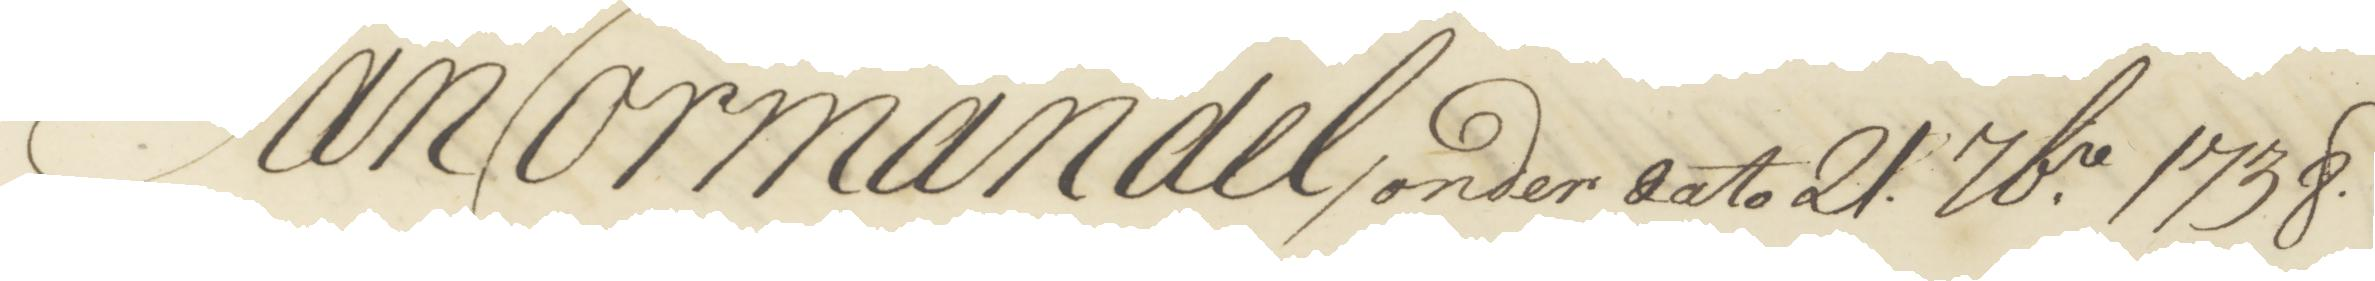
Van Cormandel, onder dato 21: 7b.r 1738.
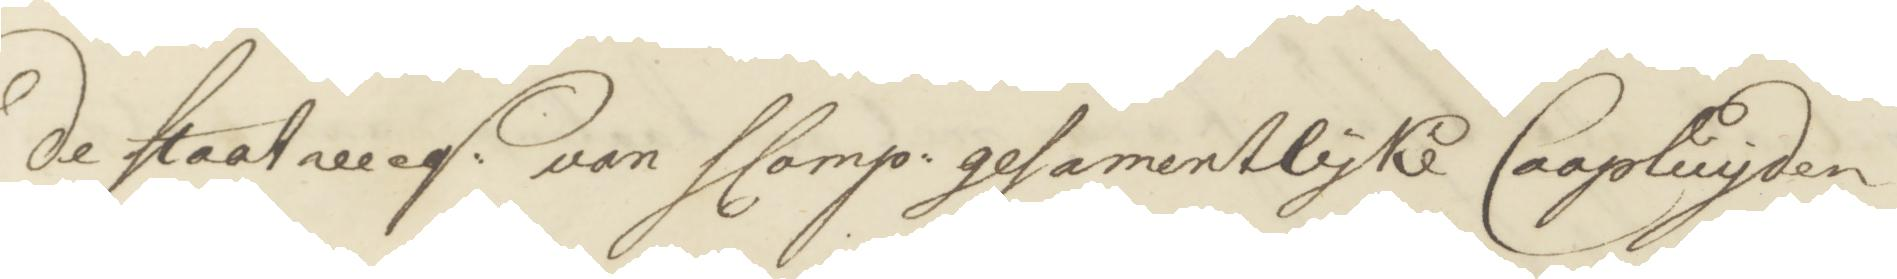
de staat reecq: van sComp: gesamentlijke Coopluijden
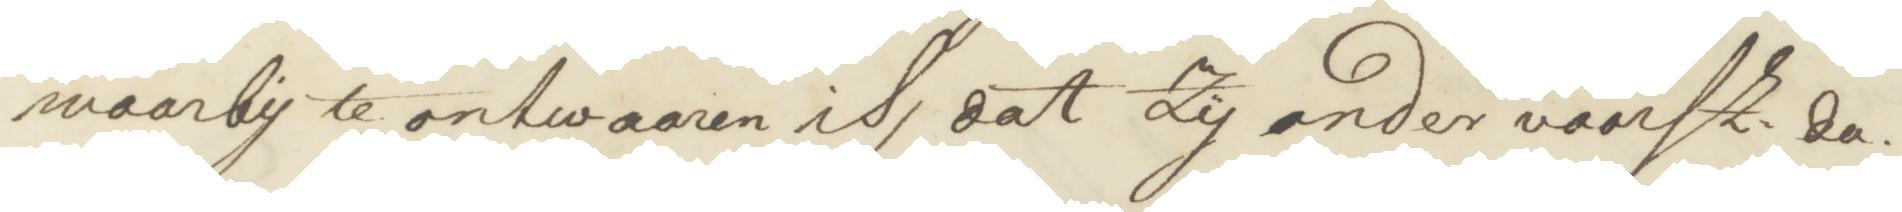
waarbij te ontwaaren is, dat zij onder voorsz: da„
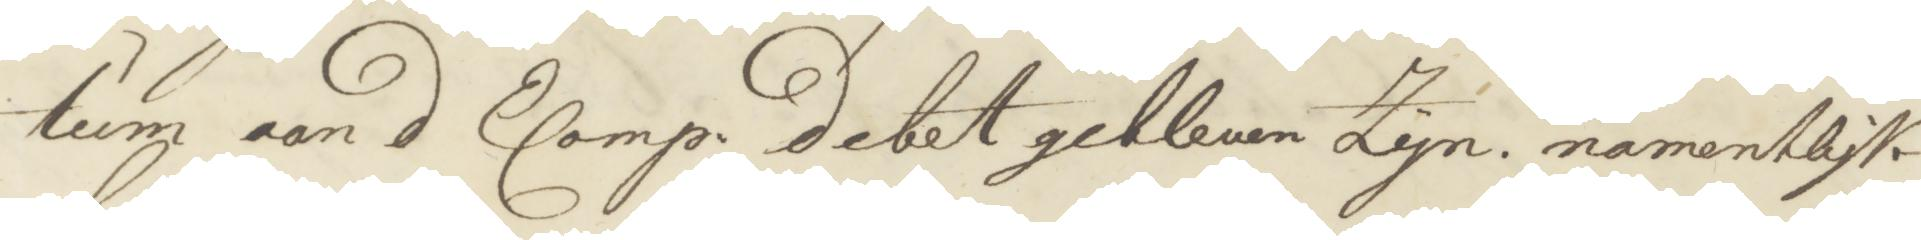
tum aan d EComp. debet gebleven zijn. namentlijk
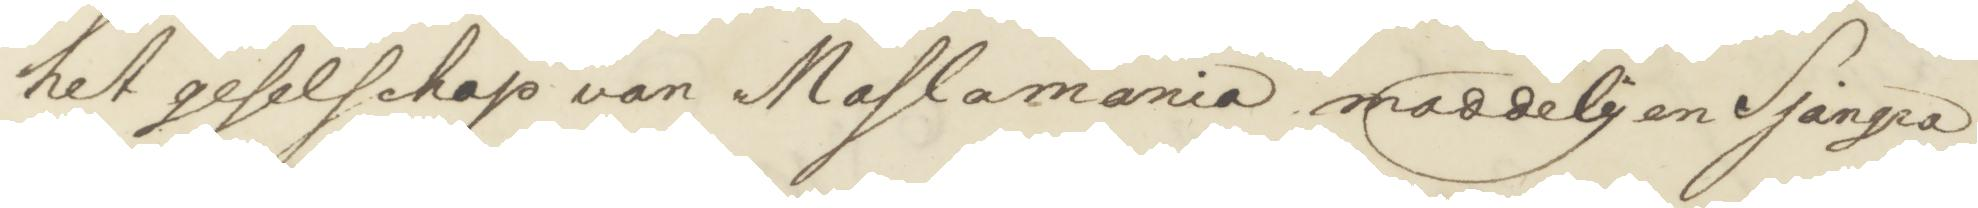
het geselschap van Maslamania moddelij en sjangra
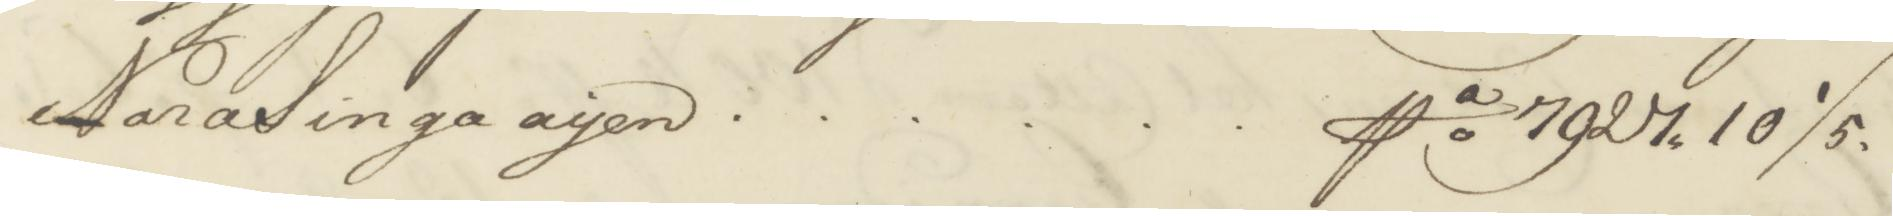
Nara singa aijen . . . . . . p a/o 7927„ 10 1/5.
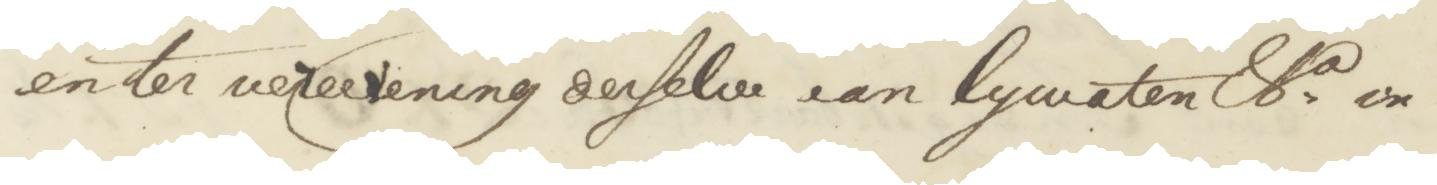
en ter vereevening derselve aan lywaten &„a vr
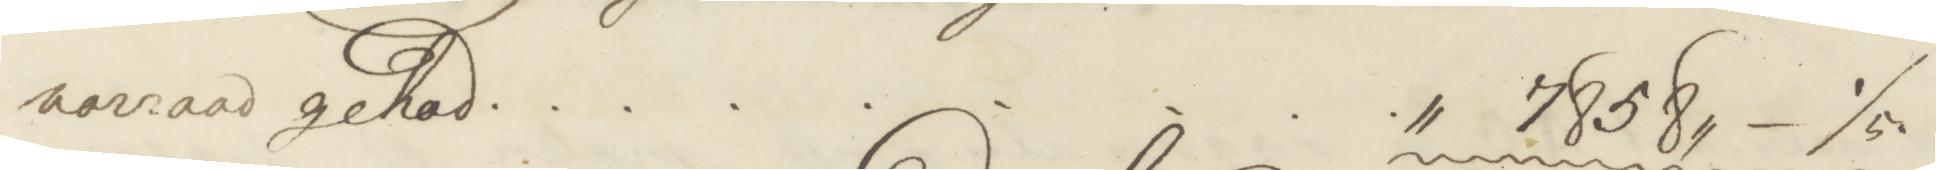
vorraad gehad . . . . . - - . . „ 7858„ — 1/5.
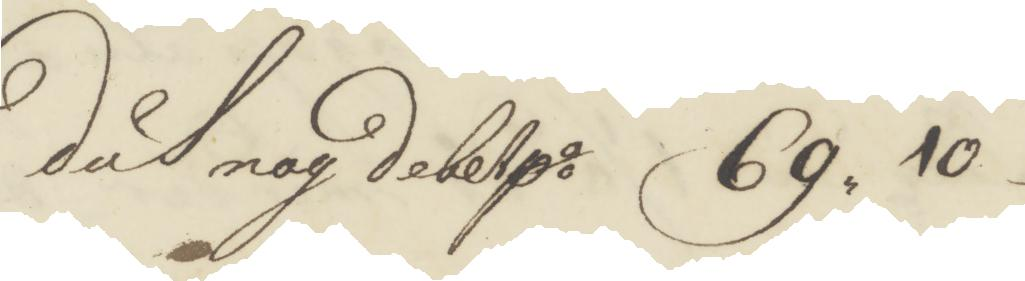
dus nog debet p a/o 69„ 10
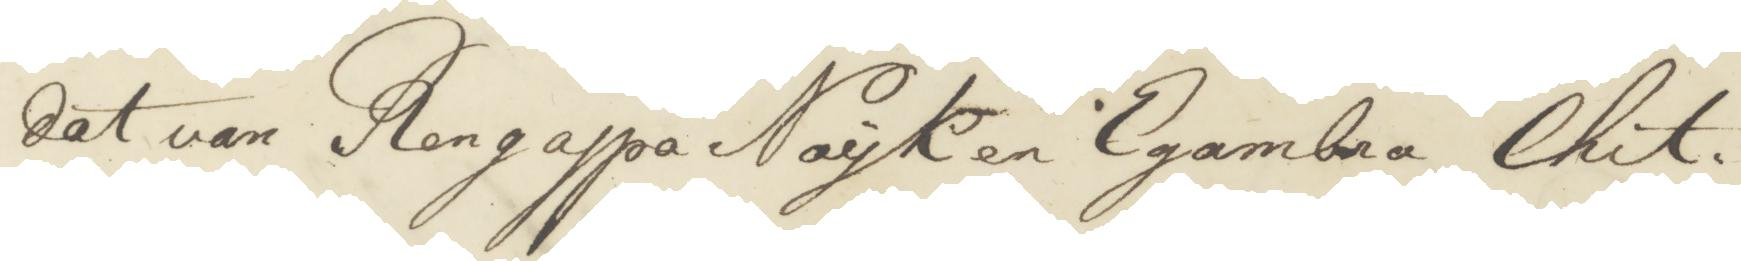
dat van Rengappa Naijk en Egambra Chit„
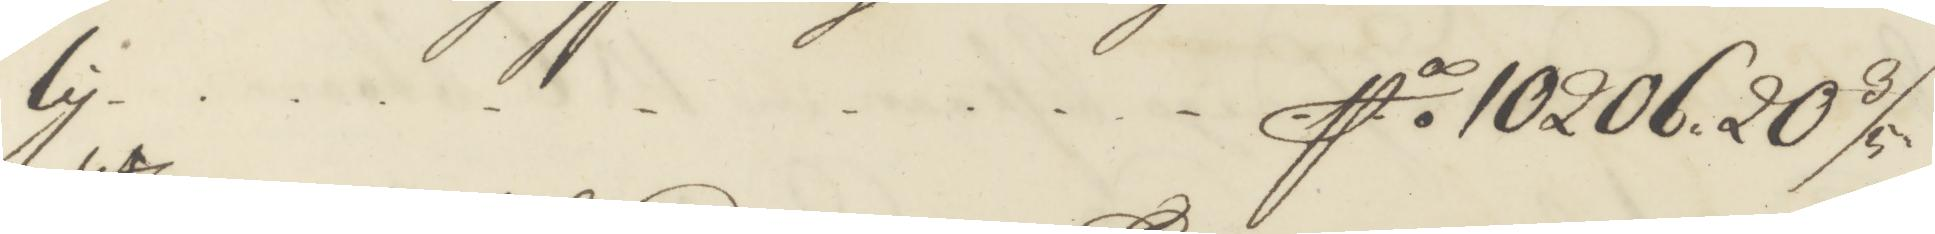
lij . . . . - - - . - . - p a/o 10206„ 20 3/5
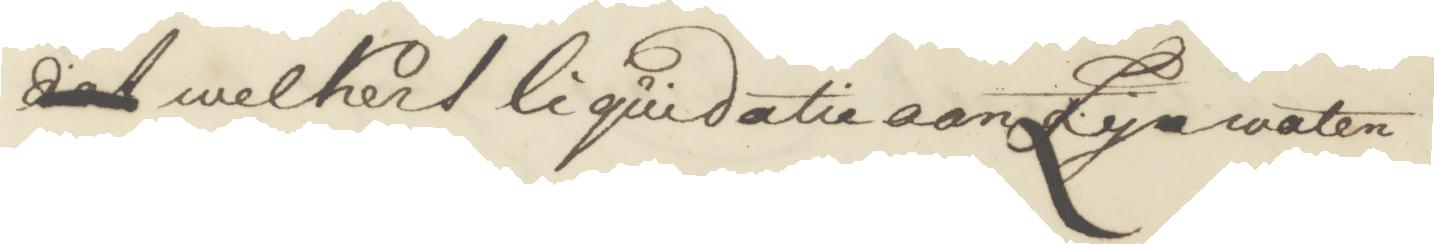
dat welkers liquidatie aan Lijwaten
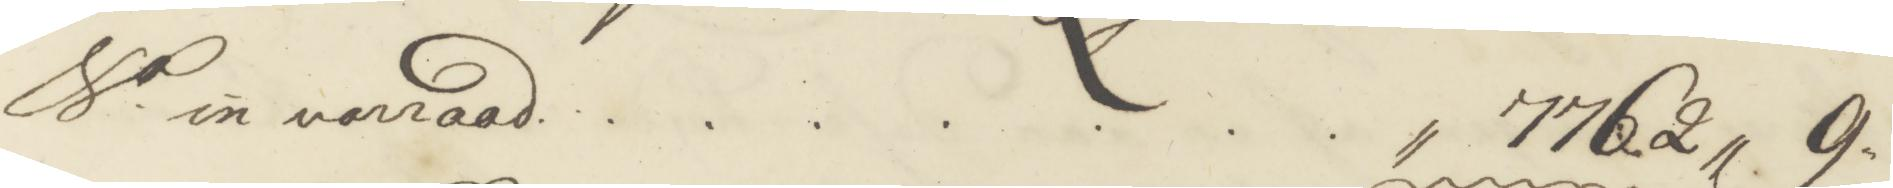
&.a in vorraad . . . . . . . . „ 7762„ 9„
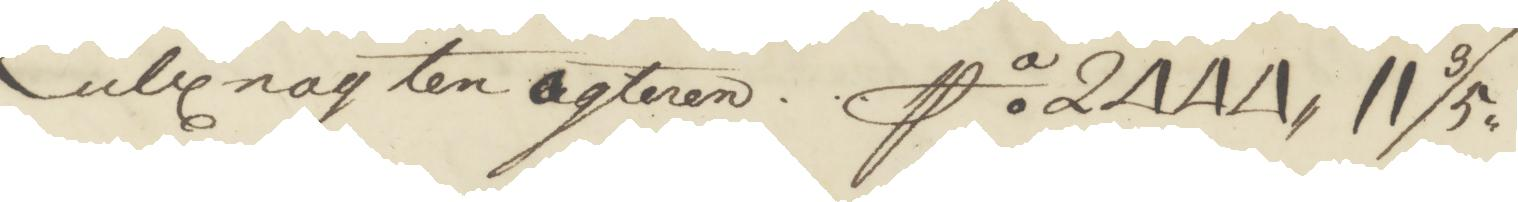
Zulx nog ten agteren . . . p a/o 2444„ 11 3/5„
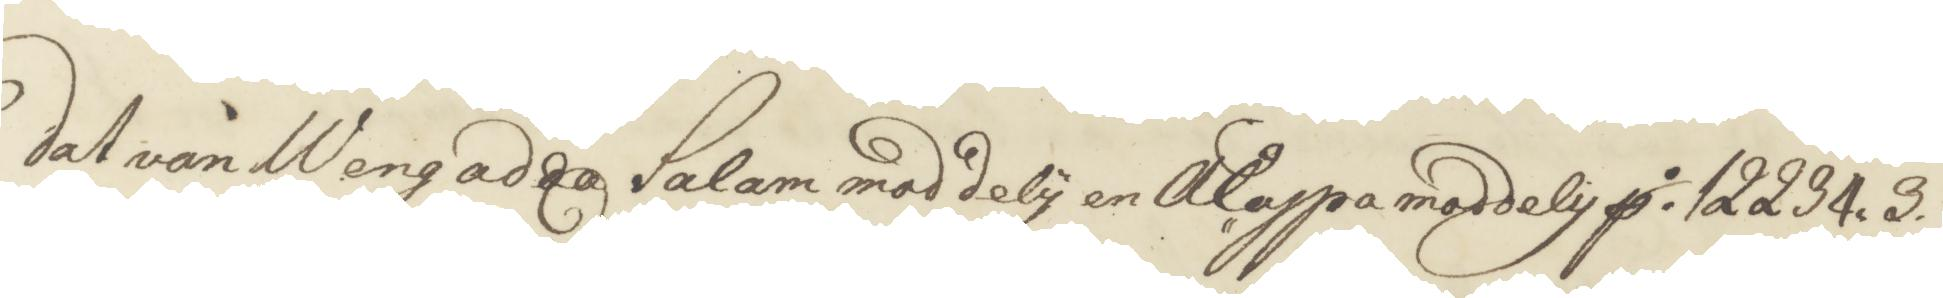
dat van Wengadda salam moddelij en alappa moddelij p a/o 12234„ 3„
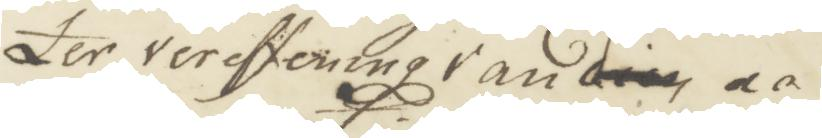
ter vereffening van diey de
